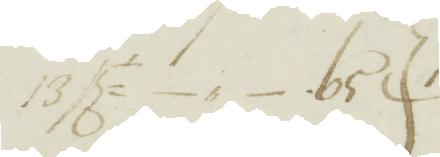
13 /c=t — „ — . 65
